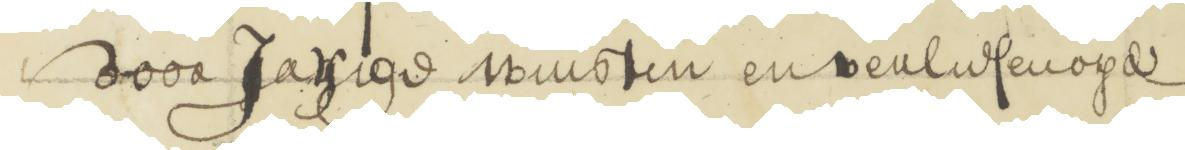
door Jarige winsten en verliesen op de
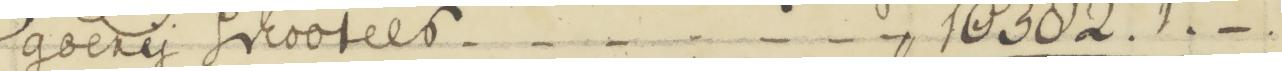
goerij schootels - - - - - - - „ 10382. 1. —.
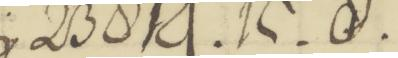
23814. 15. 8.
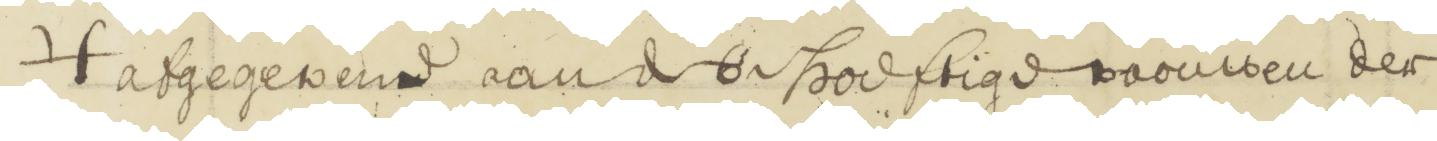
’t afgegevene aan de behoeftige vrouwen der
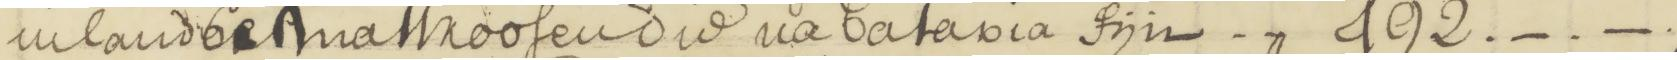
inlandse Mattroosen die na batavia sijn - - „ 492. —. —.
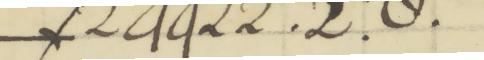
—ƒ 24422. 2: 8.
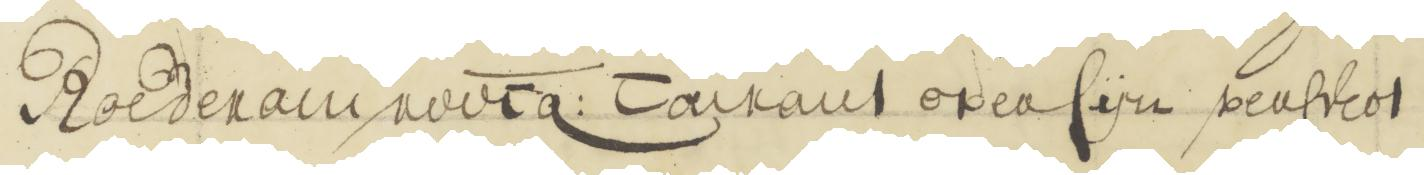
Roederam reecq: Cairant over sijn verschot
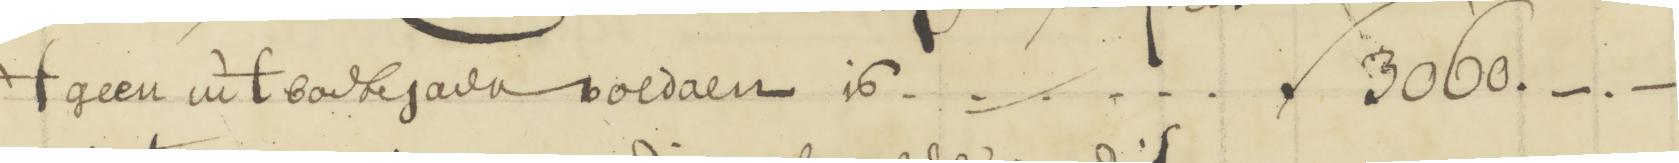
’t geen in’t boekjaer voldaen is - - - - - - ƒ 3060. —. —
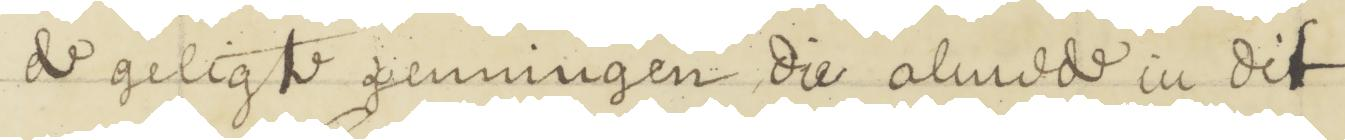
de geligte penningen, die almede in dit
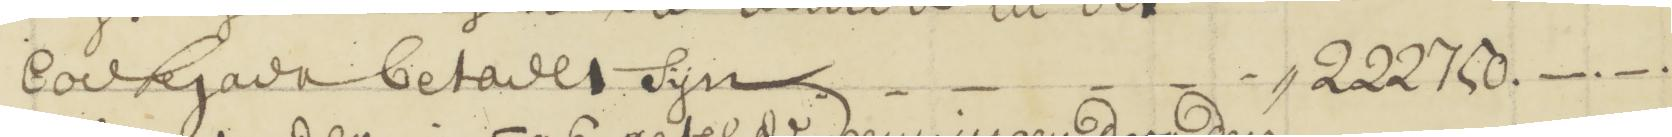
boekjaer betaelt sijn - - - - - - „ 222750. —. —.
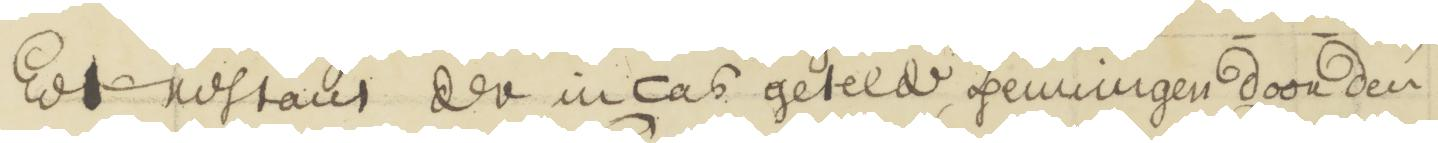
Het restant der in cas getelde penningen door den
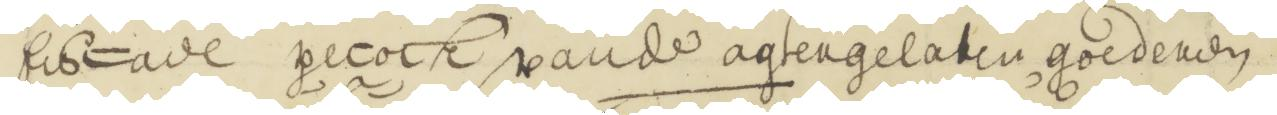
fiscael pecock vande agtergelaten goederen
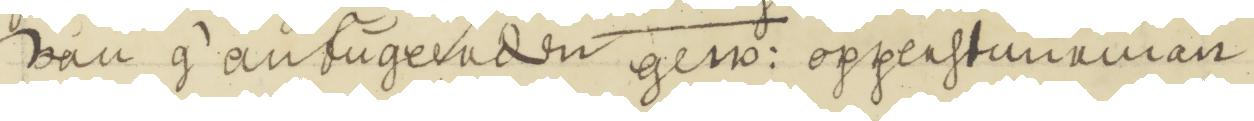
van g’aufugeerden gew: opperstuurman
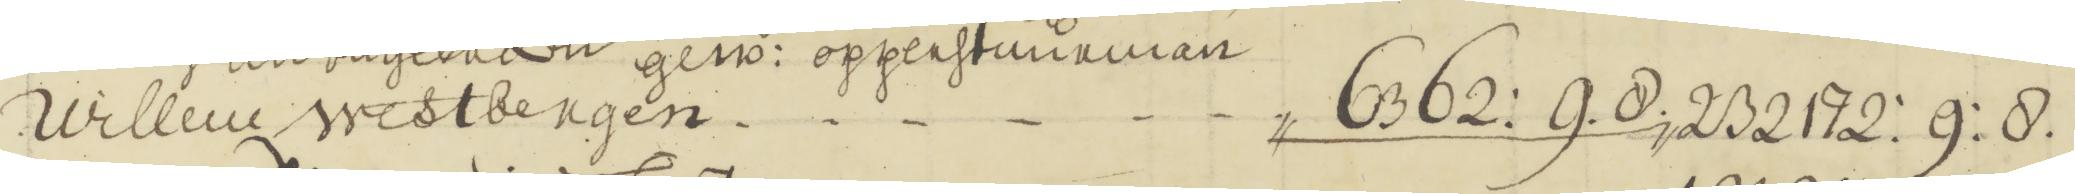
Willem westbergen - - - - - - .„ 6362. 9. 8. „ 232172: 9: 8.
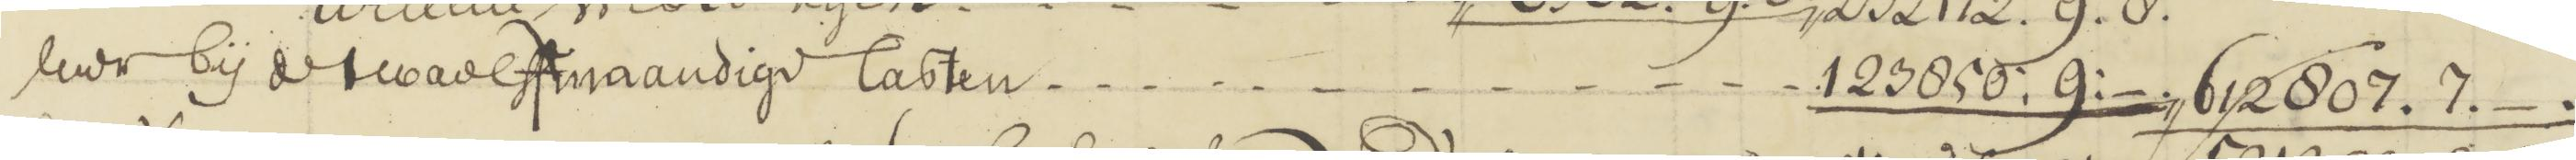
hier bij de twaelffmaandige lasten - - - - - - - - - - - - .123850: 9: —. „ 612807. 7. —.
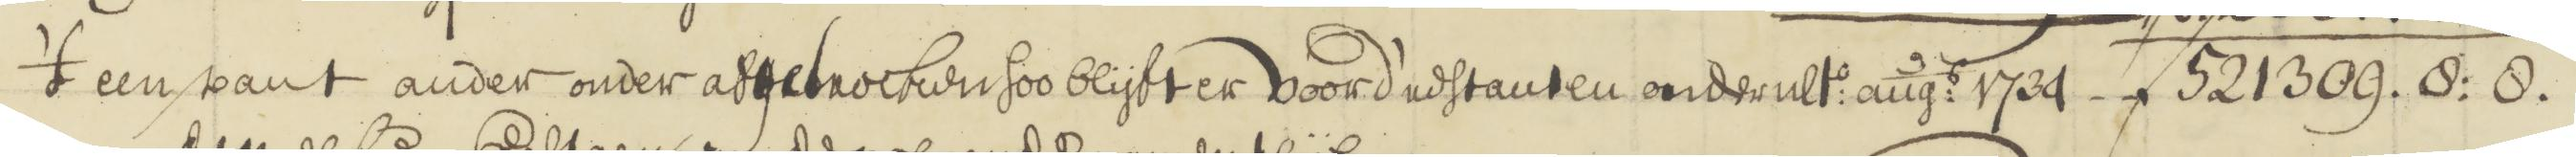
’t een vant ander onder afgetrocken soo blijft er Voor d’ restanten onder ult:o aug:s 1734 - - ƒ 521309. 8: 8.
